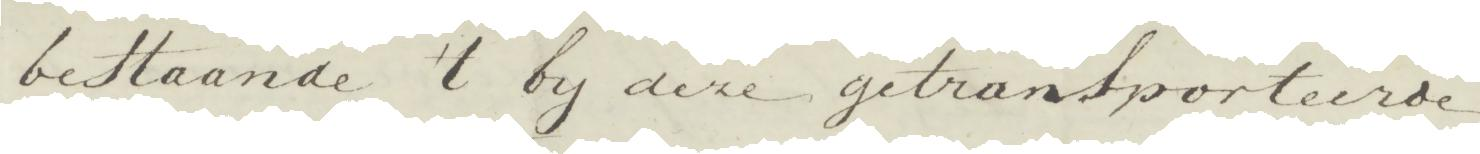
bestaande ’t by deze getransporteerde
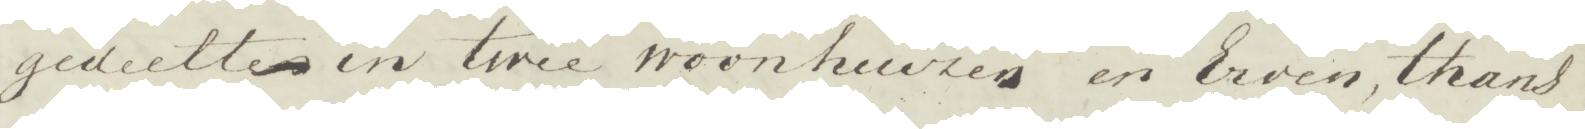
gedeelte en twee woonhuizen en Erven, thans
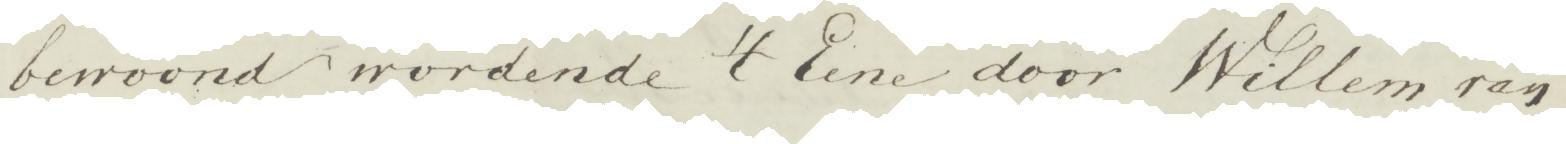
bewoond wordende ’t Eene door Willem van
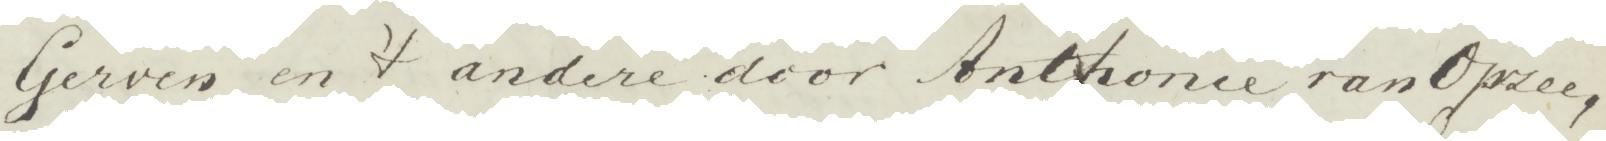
Gerven en ’t andere door Anthonie van Opzee,
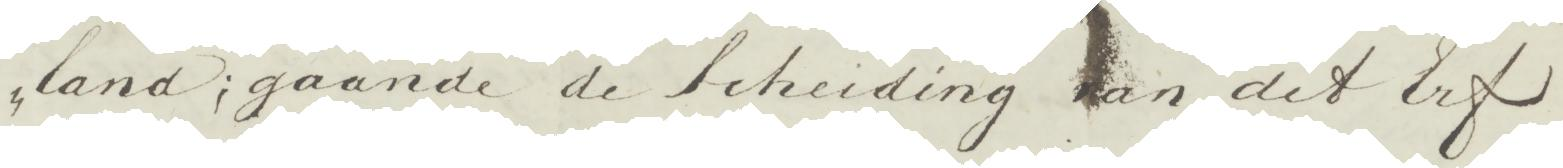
„land; gaande de scheiding van dit Erf
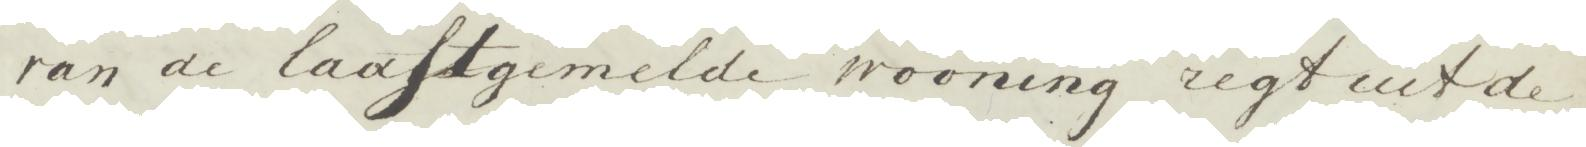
van de laastgemelde wooning regt uit de
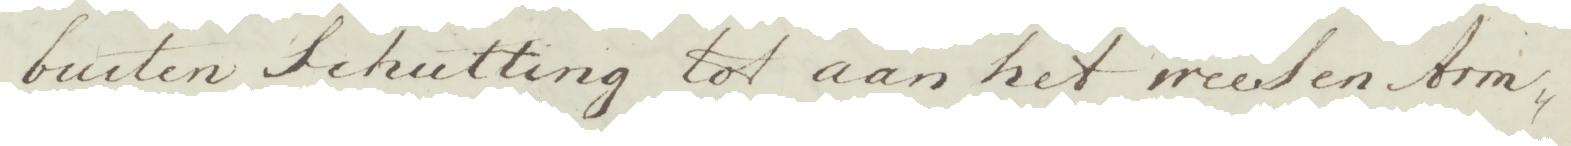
buiten schutting tot aan het weesen Arm„
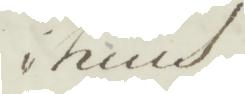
„huis.
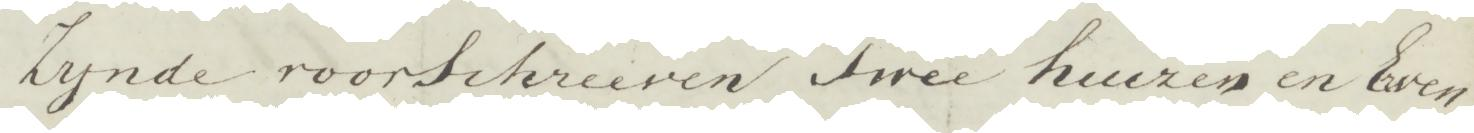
Zynde voorschreeven Twee huizen en Erven
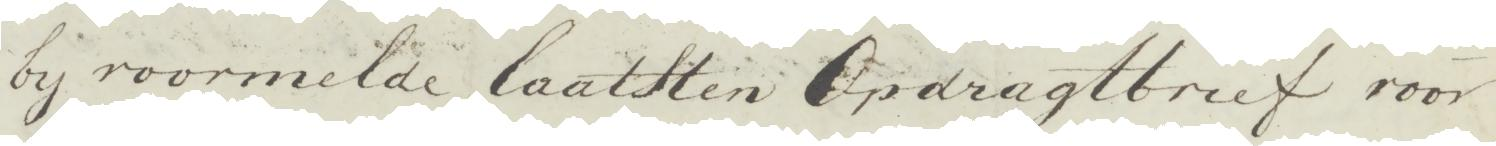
by voormelde laatsten Opdragtbrief voor
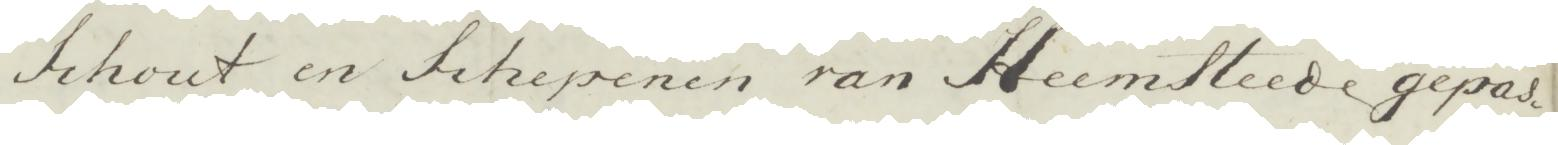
schout en schepenen van Heemsteede gepas„
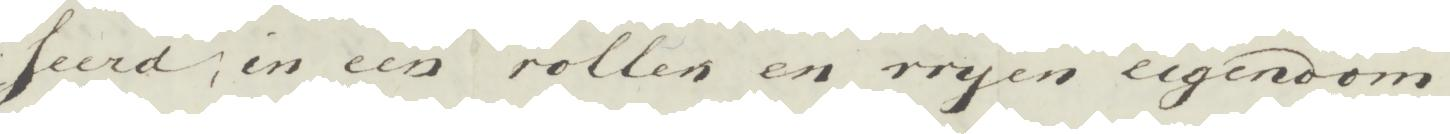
=seerd, in een vollen en vryen eigendom
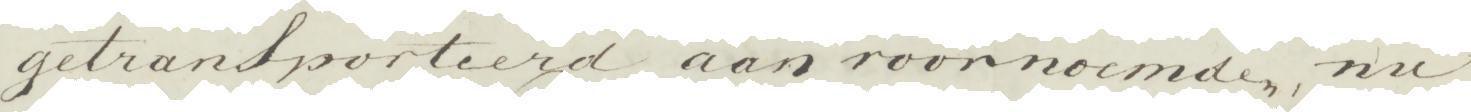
getransporteerd aan voornoemden, nu
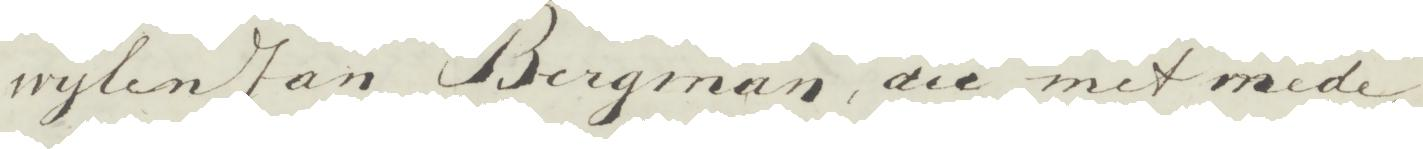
wylen Jan Bergman, die met mede
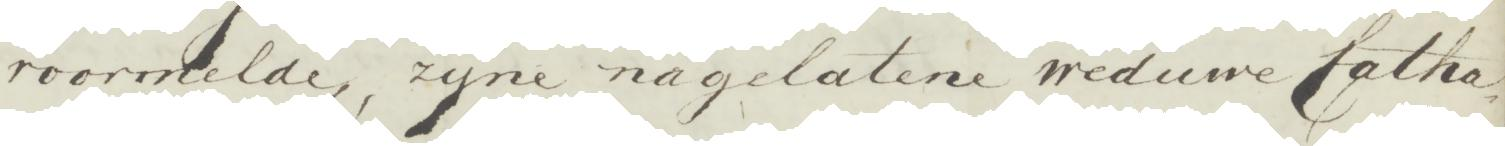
voormelde zyne nagelatene weduwe Catha=
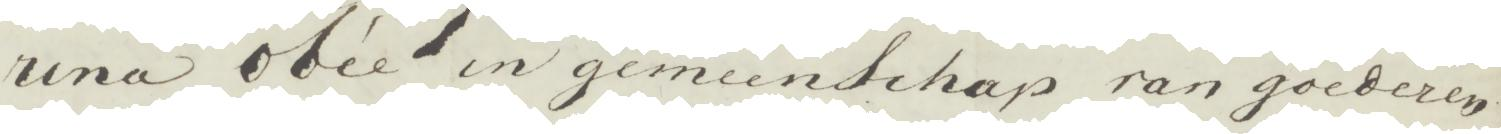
rina Obée in gemeenschap van goederen
